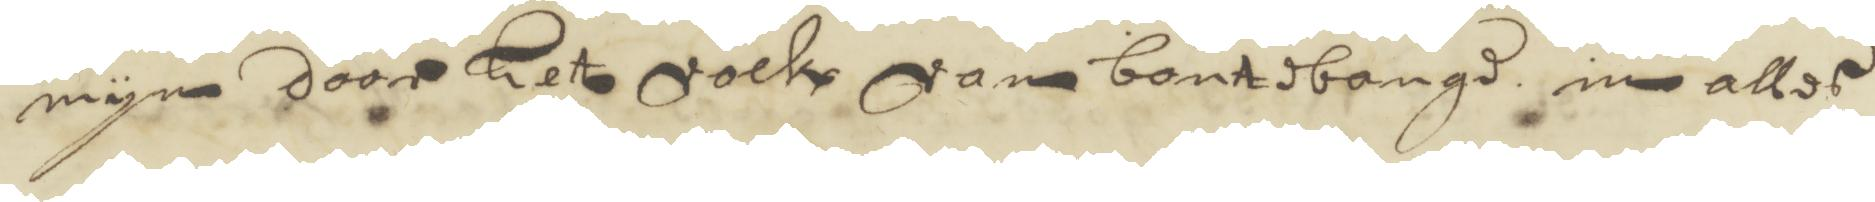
mijn door het volk van bontebange in alles
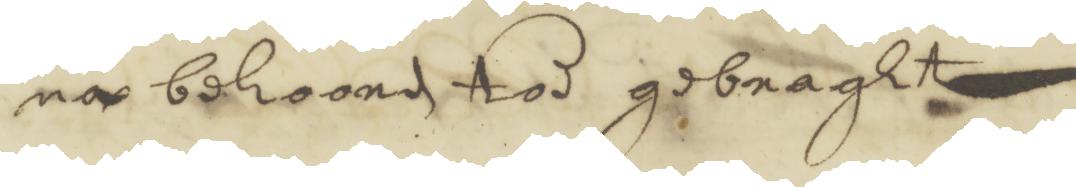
na behooren toe gebraght
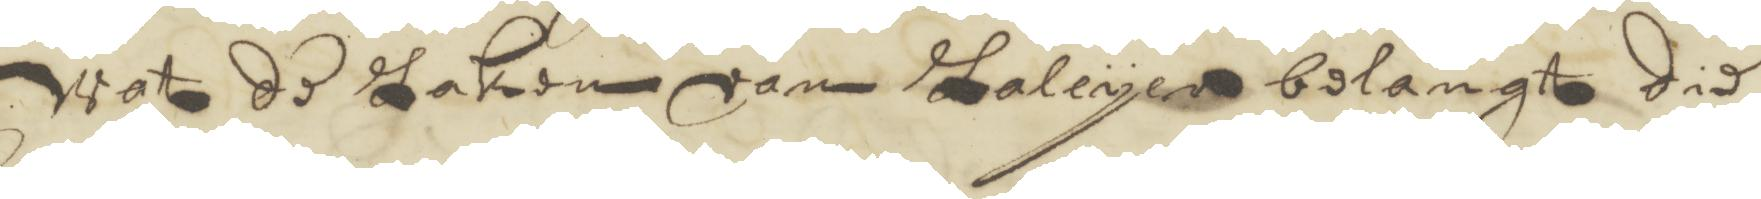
wat de zaken van zaleijen belangt die
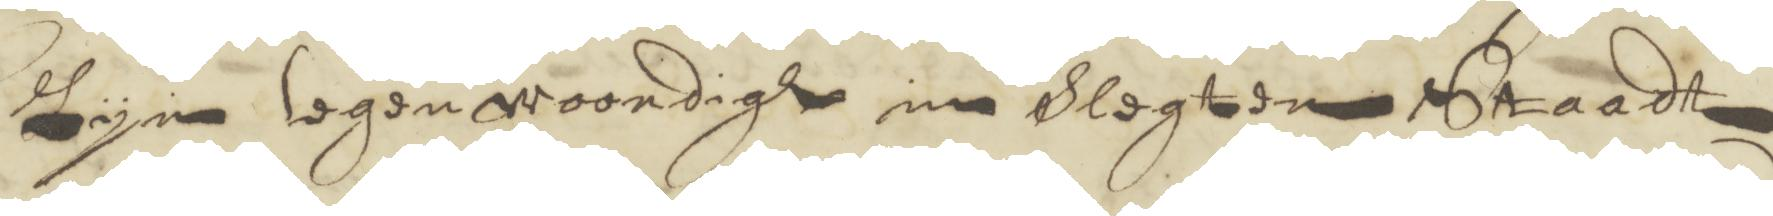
zijn tegenwoordigh in slegten staadt
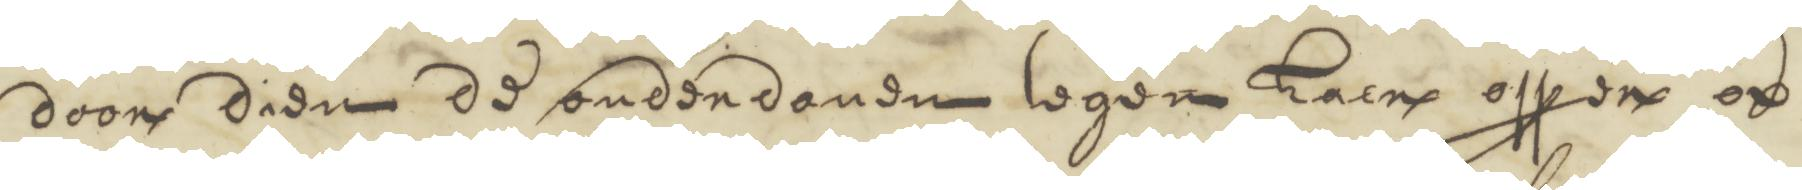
door dien de onderdanen tegen haer opper op
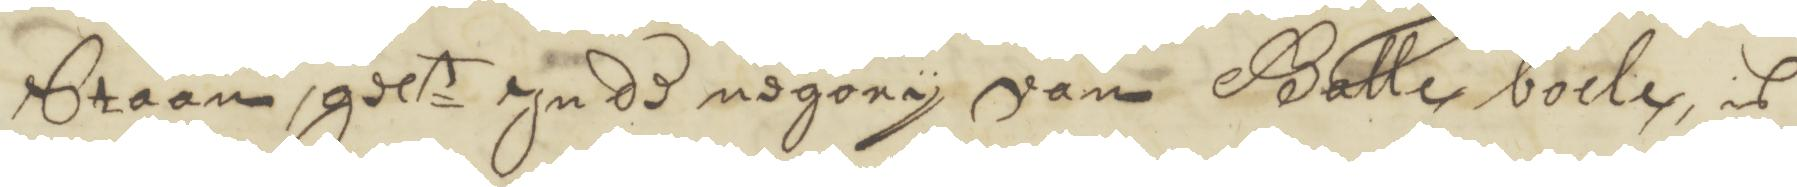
staan, ges=t inde negorij van Balle boele, is
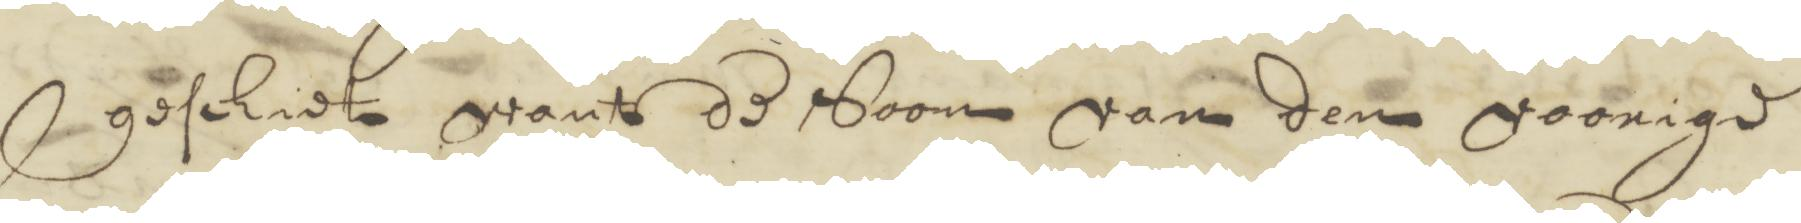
geschiet want de soon van den voorige
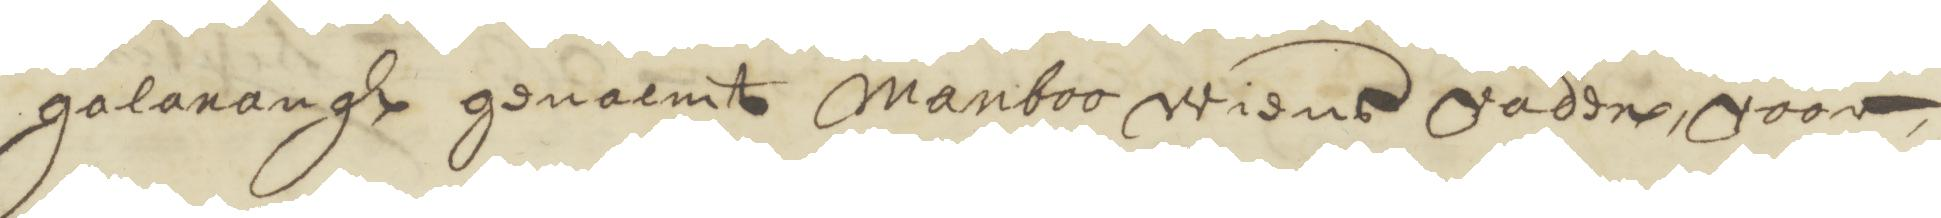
galarangh genaemt manboo wiens vader, voor,
